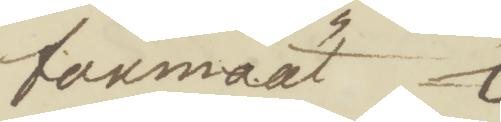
formaat
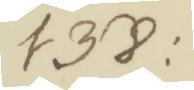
138:
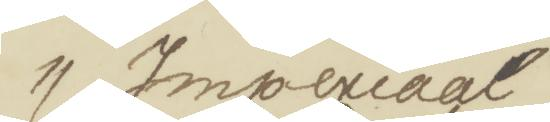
„ Jmperiaal
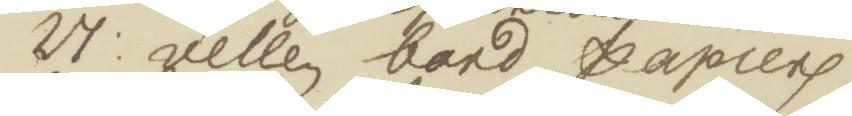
27: vellen bord papier
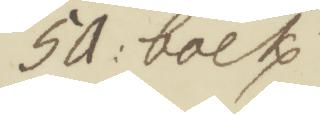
54: boek
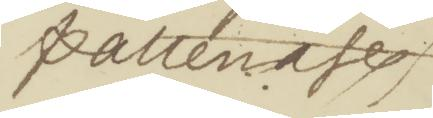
pattenase
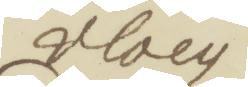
vloeij
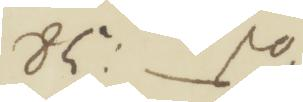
85: _„o
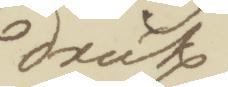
druk
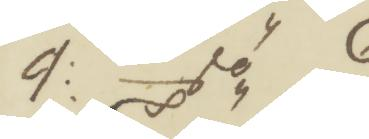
4: _„o
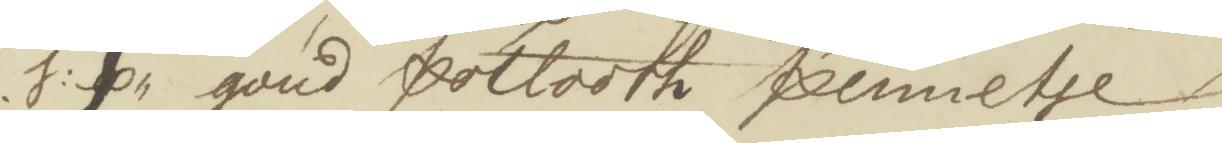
1: p„s goud potlooth pennetje
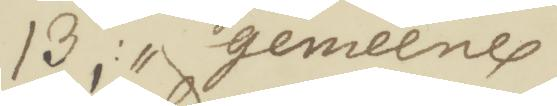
13: „ gemeene
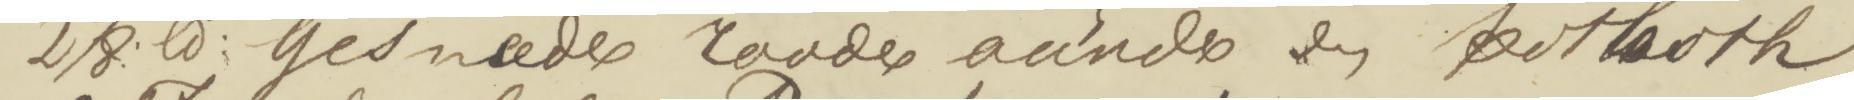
2 1/8: lb: gesneede roode aarde en potlooth
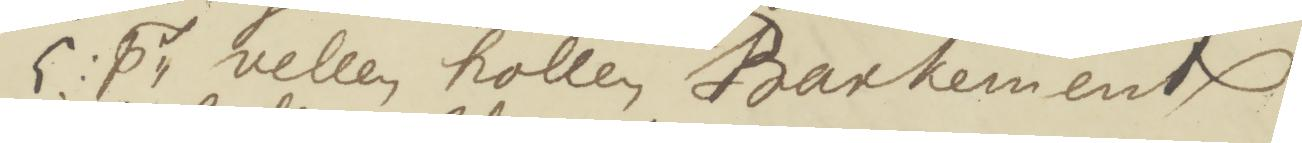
5: p„s vellen hollen Barkement
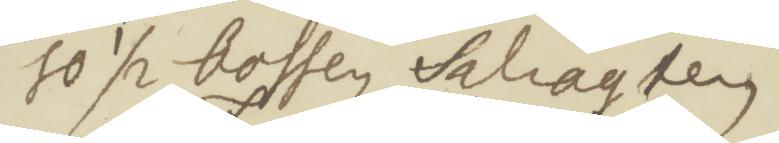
10½ bossen schagten
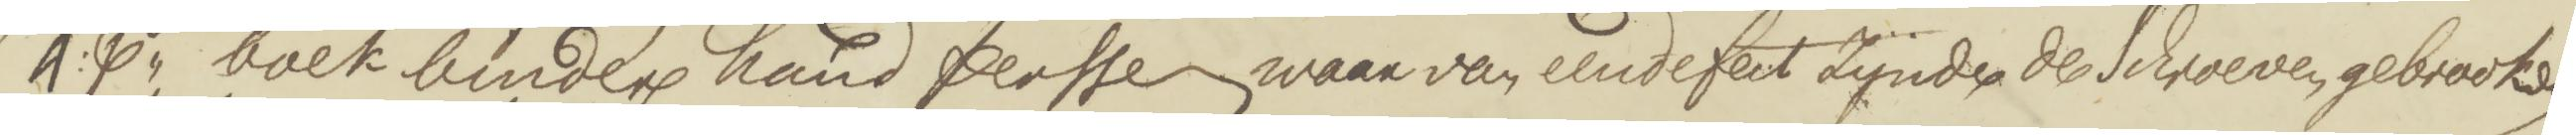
4: p„s boek binder hand persse waar van een defect zijnde de schroeven gebrooken
